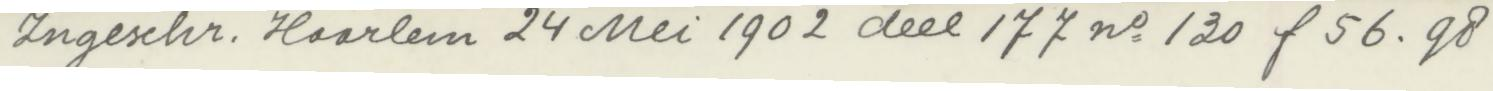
Ingeschr. Haarlem 24 Mei 1902 deel 177 n=o 130 ƒ 56. 98
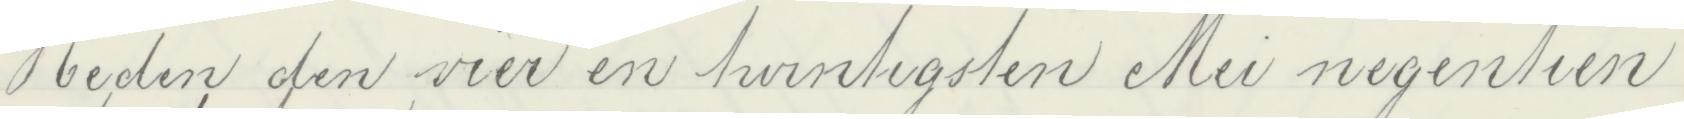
Heden den vier en twintigsten Mei negentien
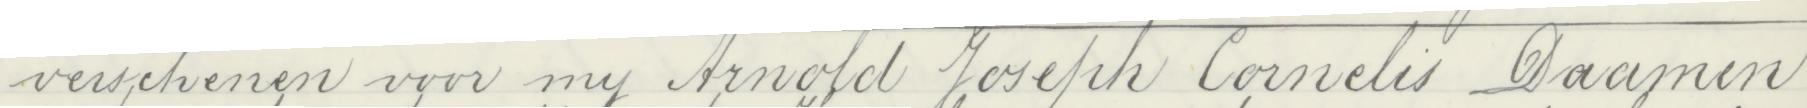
verschenen voor my Arnold Joseph Cornelis Daamen
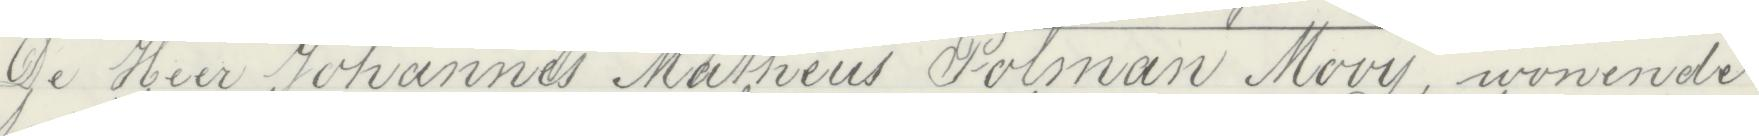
De Heer Johannes Matheus Polman Mooy, wonende
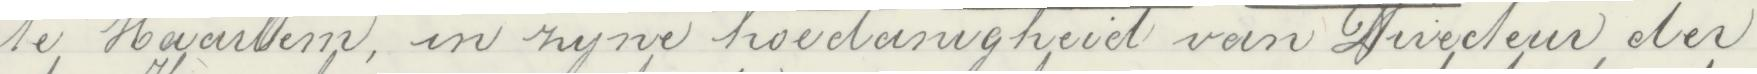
te Haarlem, in zyne hoedanigheid van Directeur der
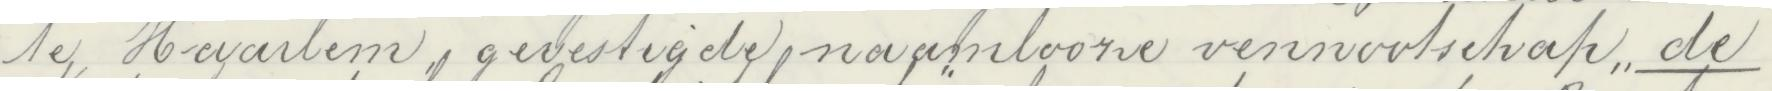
te Haarlem, gevestigde naamlooze vennootschap „ de
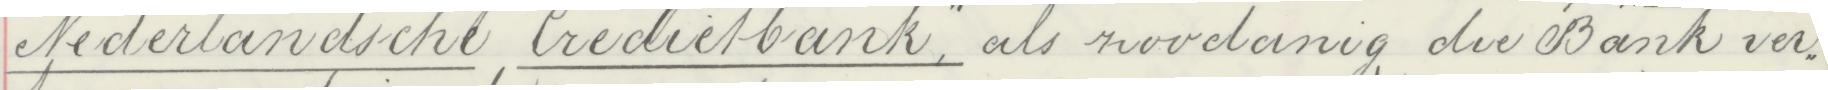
Nederlandsche Credietbank, als zoodanig die Bank ver„
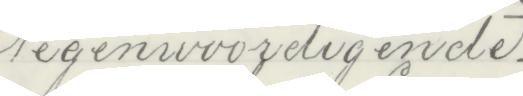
tegenwoordigende
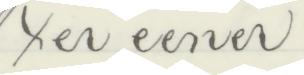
ter eener
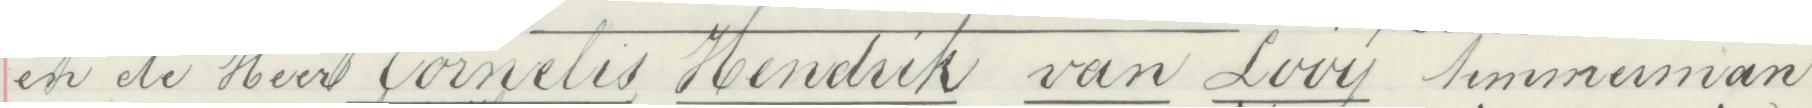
en de Heer Cornelis Hendrik van Looy Timmerman
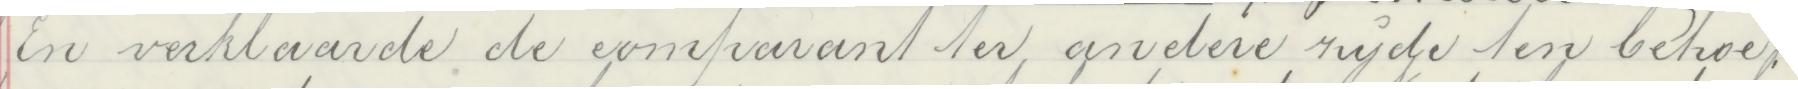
En verklaarde de comparant ter andere zijde ten behoe,
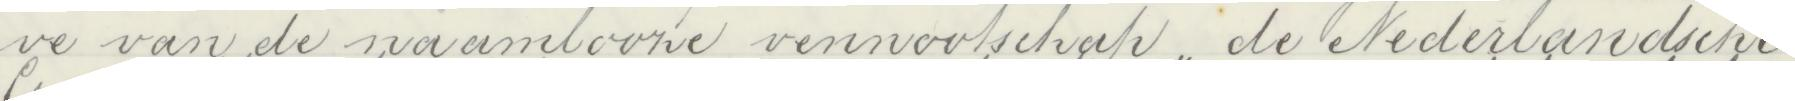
ve van de naamlooze vennootschap „ de Nederlandsche
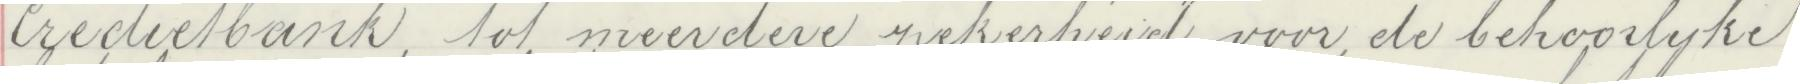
Credietbank, tot meerdere zekerheid voor de behoorlyke
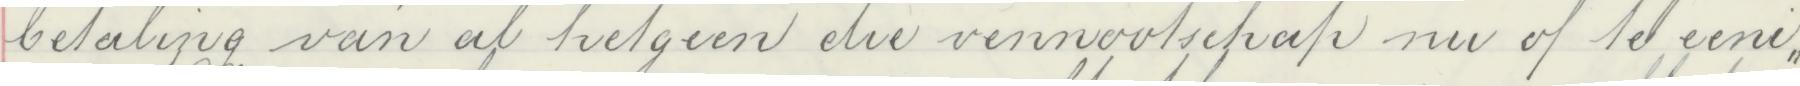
betaling van al hetgeen die vennootschap nu of te eeni
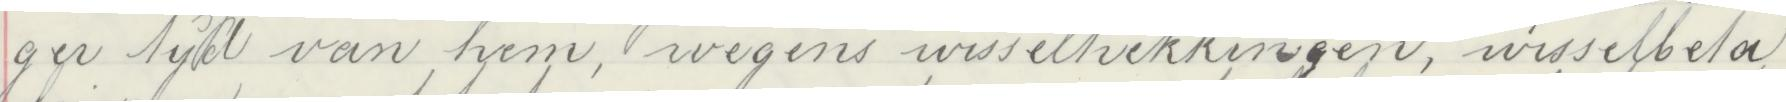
gen tijd van hem, wegens wisseltrekkingen, wisselbeta
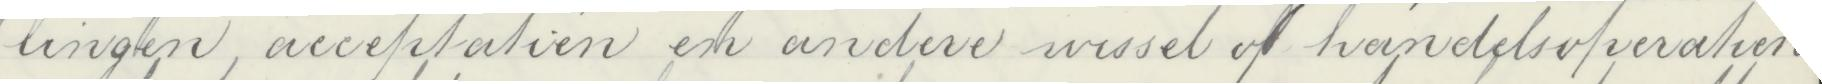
lingen acceptatien en andere wissel of handels operatien
